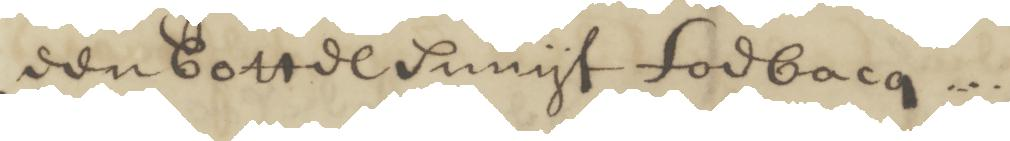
een bottel snuijf toebacq - - -
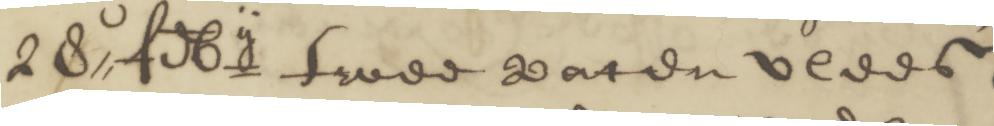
28„e feb=ij twee vaten vlees
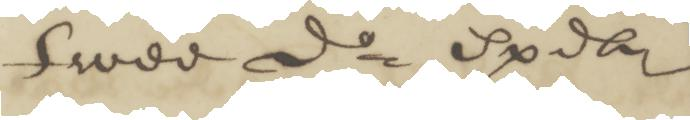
twee d=o spek
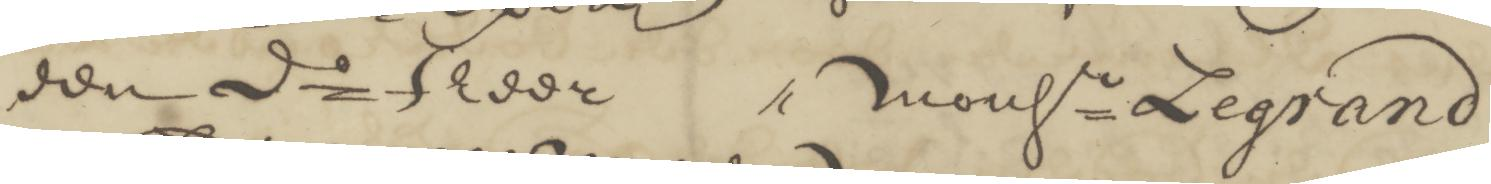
een d=o theer „ mons=r Legrand
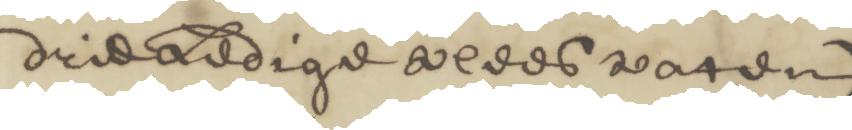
drie Ledige vlees vaten
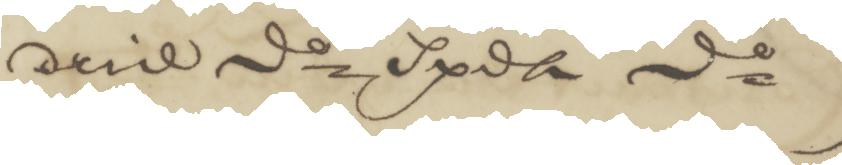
drie d=o spek d=o
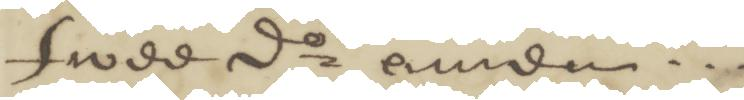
twee d=o amen - -
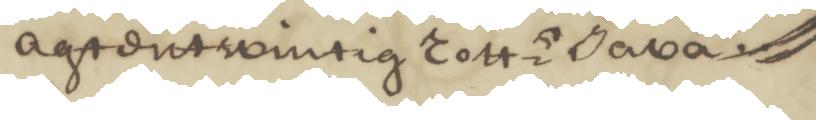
agtentwintig Rott=s Iava -
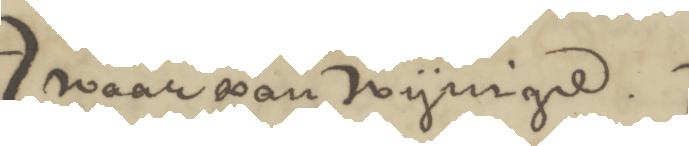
} waar van Wijnige
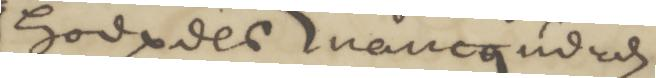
hoepels Mancqueren
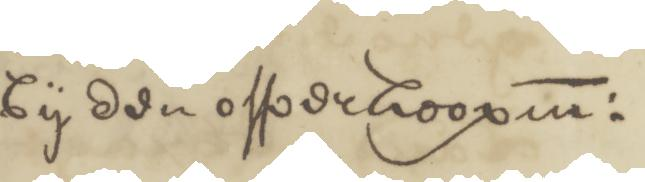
bij den opperkoopm:
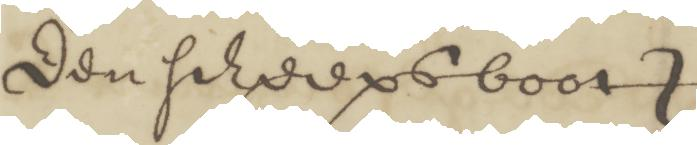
Een scheepsboot }
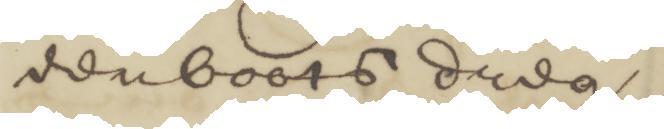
een boots dreg
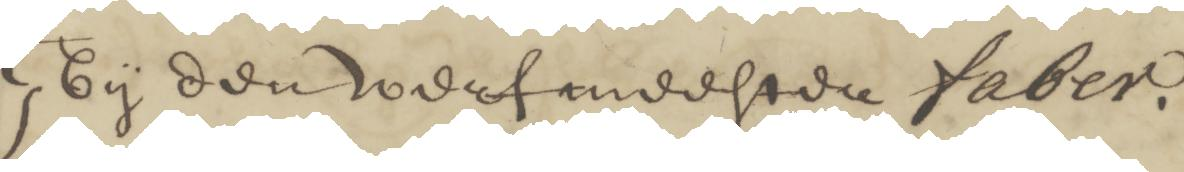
} bij den Werfmeester faber.
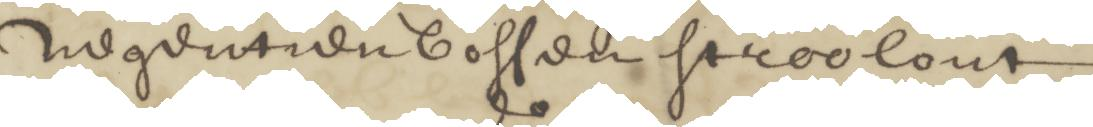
Negentien bossen stroolont
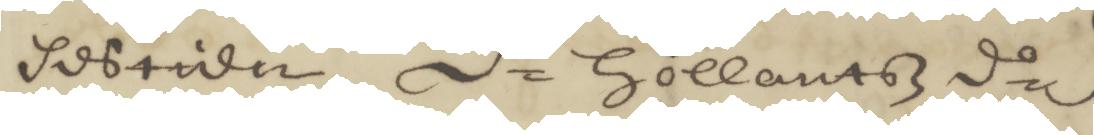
sestien d=o hollantsz d=o
